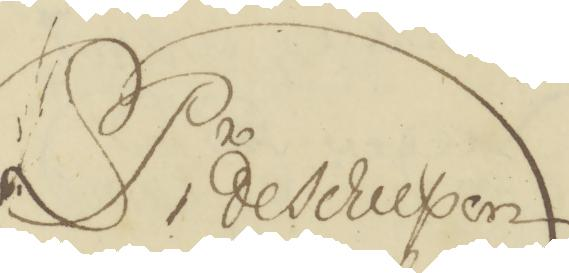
P,r de scheepen
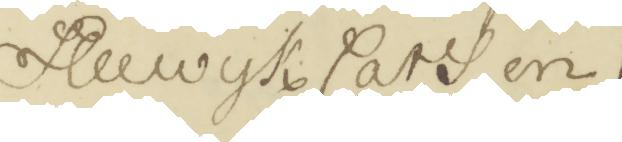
Sleewyk Cats en
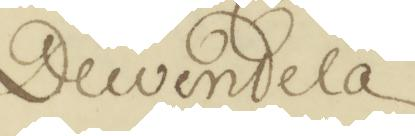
Dewendela
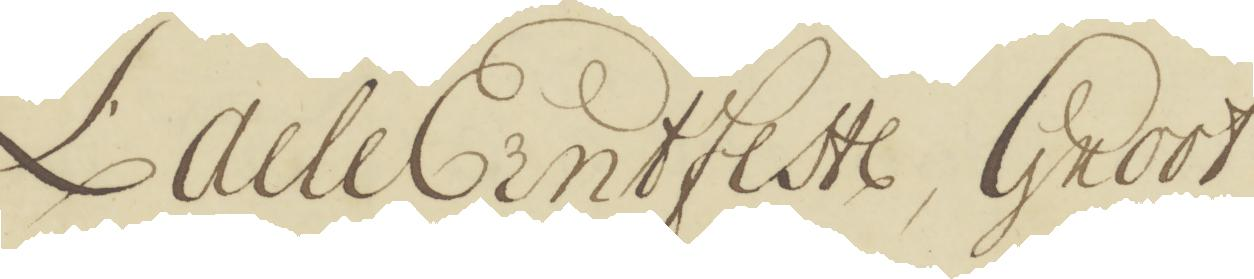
Edele Erntfeste, Groot
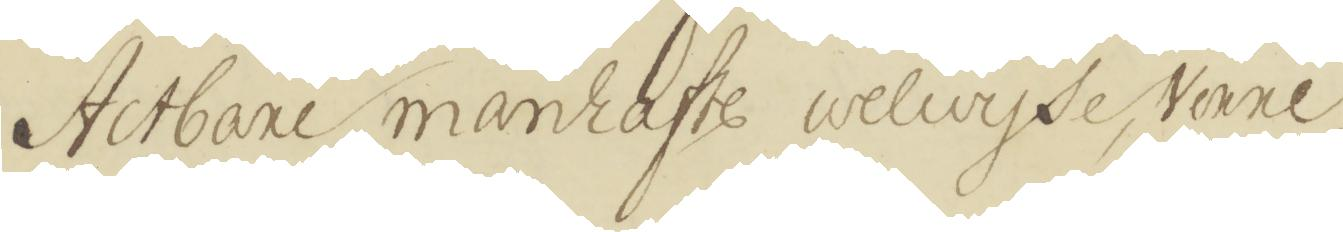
Actbare, manhafte welwyse, verre
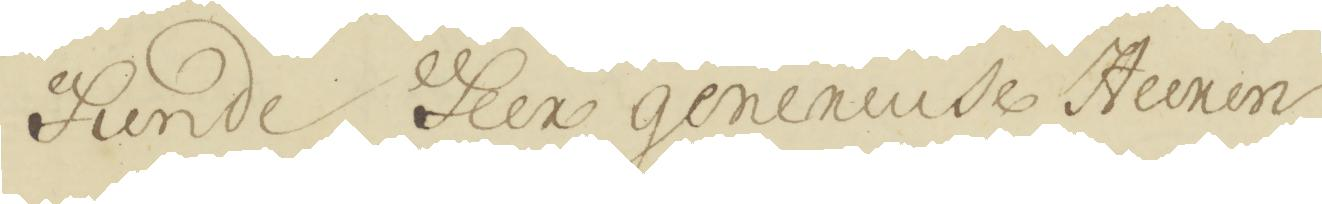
siende, seer genereuse Heeren
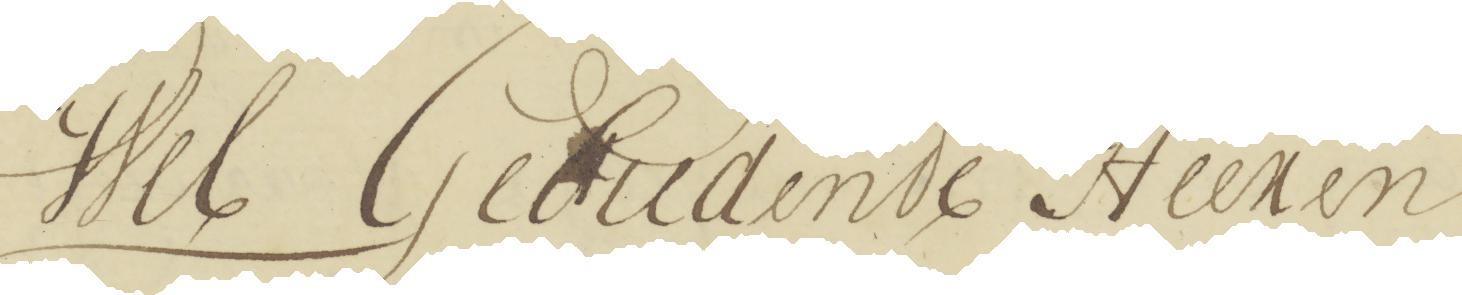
Wel Gebiedende Heeren
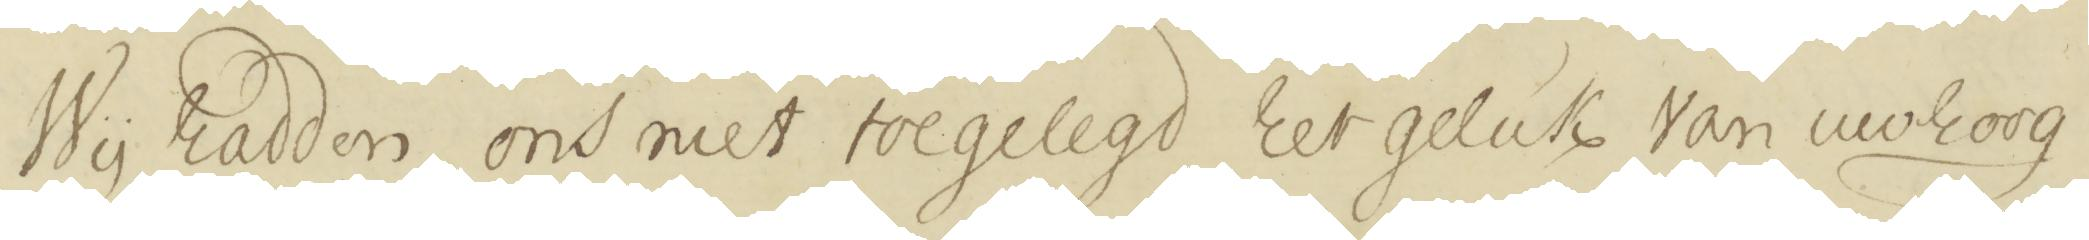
Wij hadden ons niet toegelegd het geluk van uw hoog
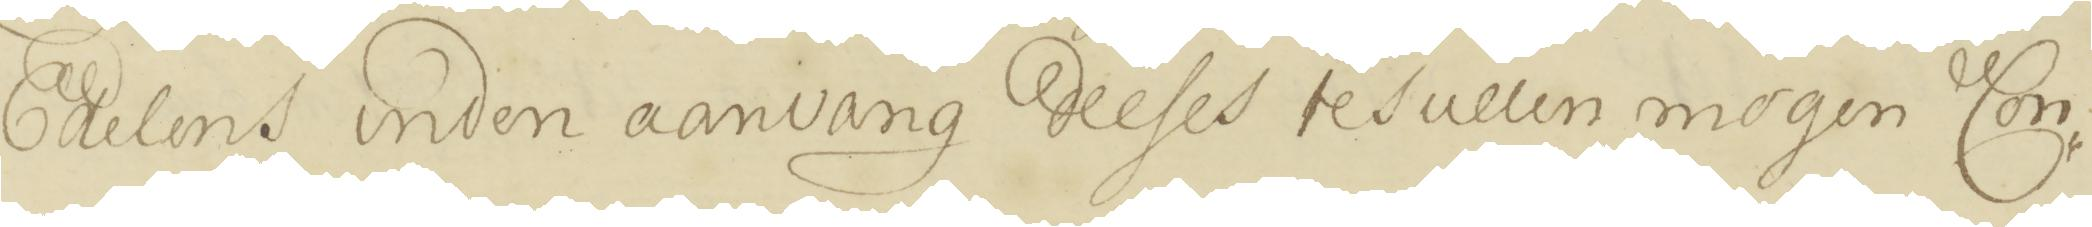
Edelens in den aanvang deeses te sullen mogen Con„
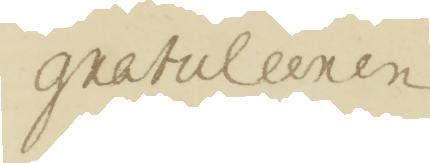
gratuleeren
